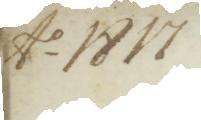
A-o 1817
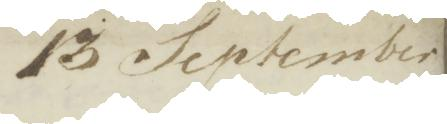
13 September
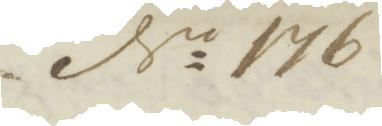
N=o 176
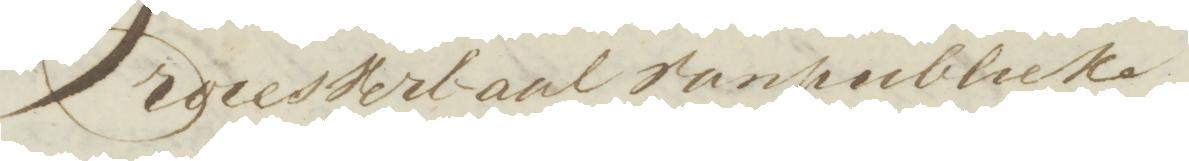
Proces verbaal van publieke
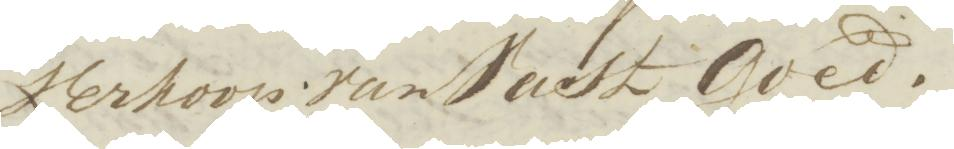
verkoop van Vast Goed.
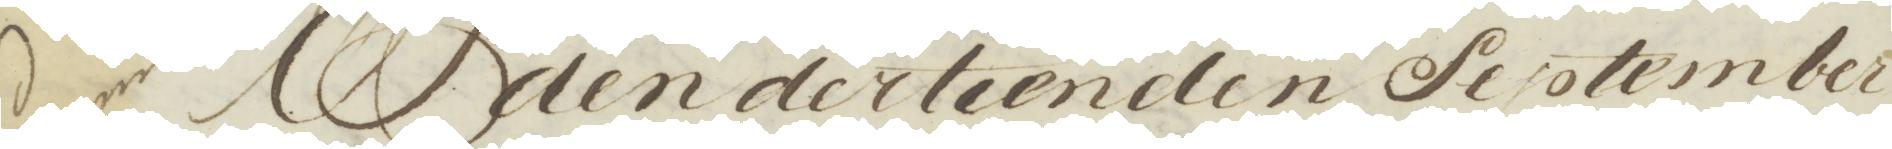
OP den dertienden September
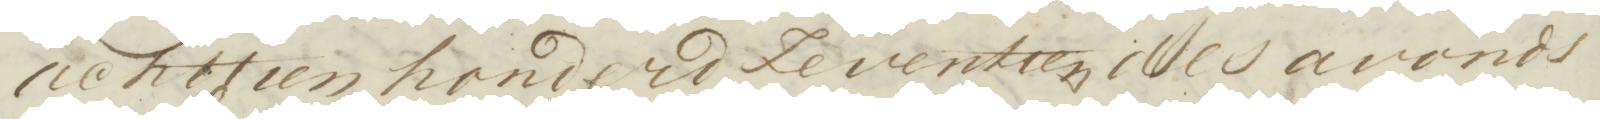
achttien honderd zeventien des avonds
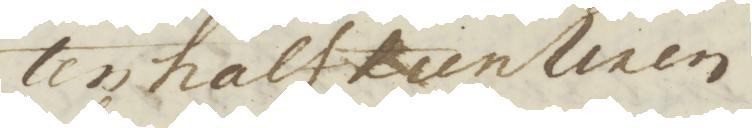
ten halftien uren
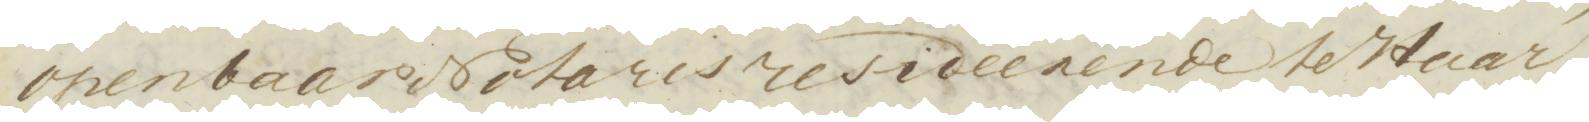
openbaar Notaris resideerende te Haar
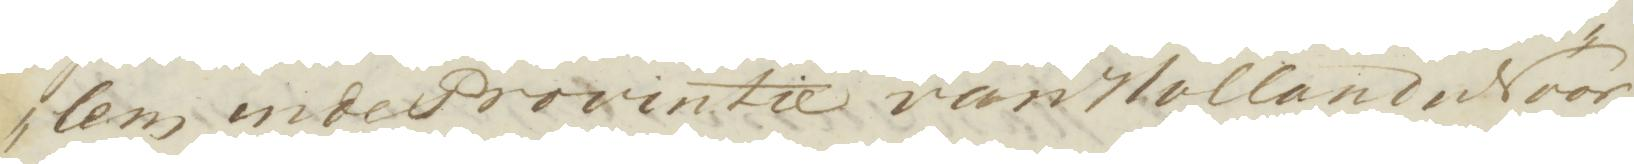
„lem in de Provintie van Holland, Noor
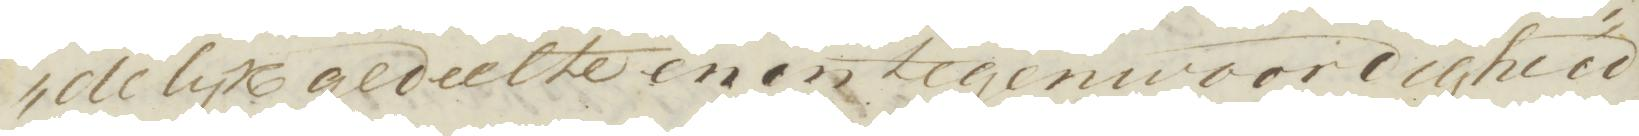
delyk gedeelte en in tegenwoordigheid
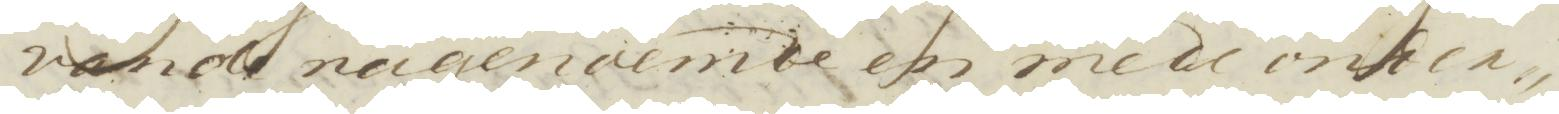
van de nagenoemde en mede onder„
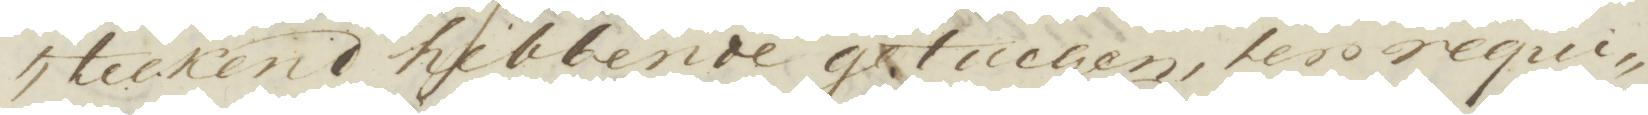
teekend hebbende getuigen, ter requi„
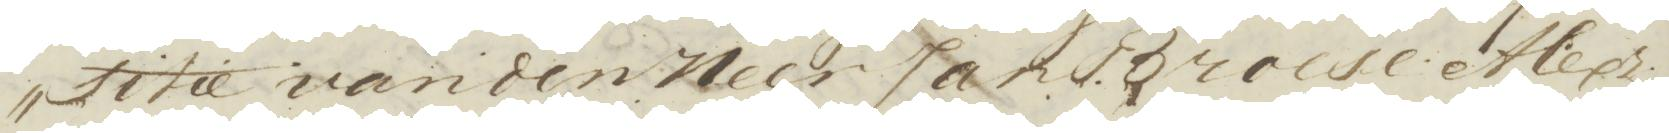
„sitie van den Heer Jan Broese Alexz.
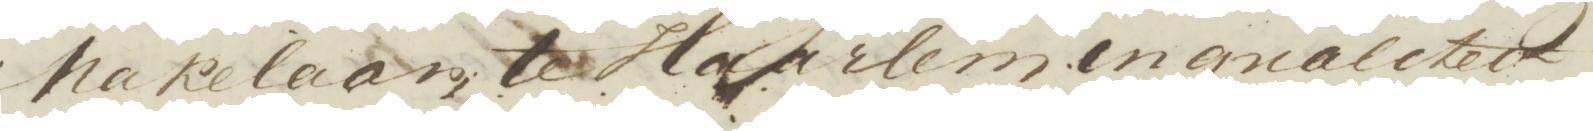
Makelaar te Haarlem in qualiteit
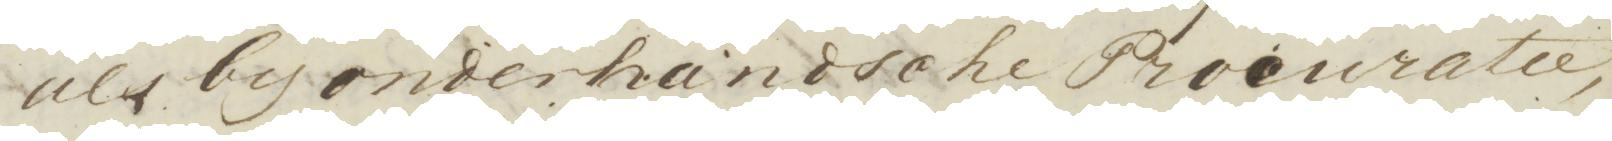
als by onderhandsche Procuratie,
